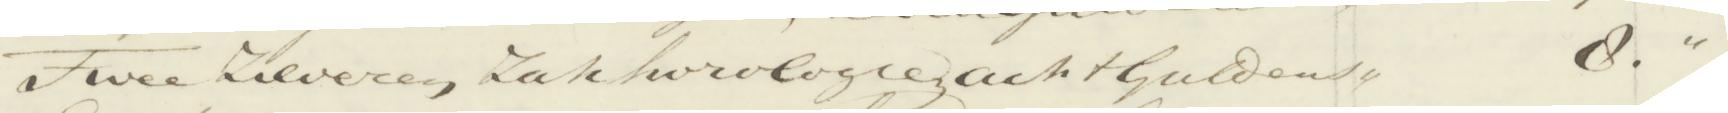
Twee Zilveren Zak horologien acht Guldens„ 8. „
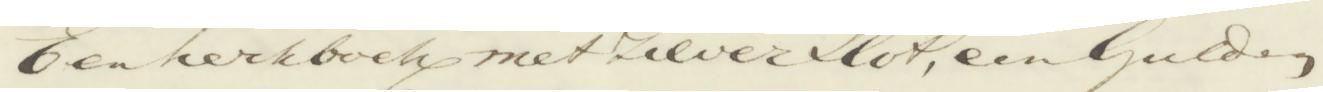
Een kerkboek met zilver slot, een Gulden
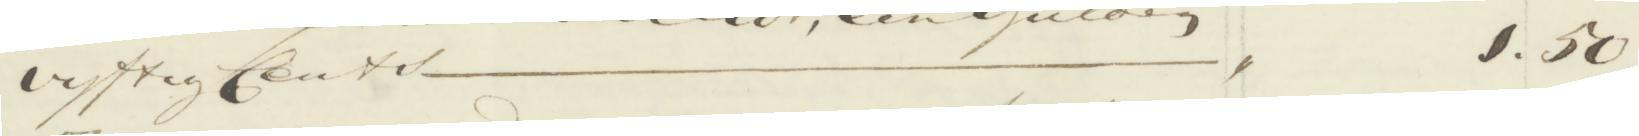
vyftig Cents—„ 1. 50
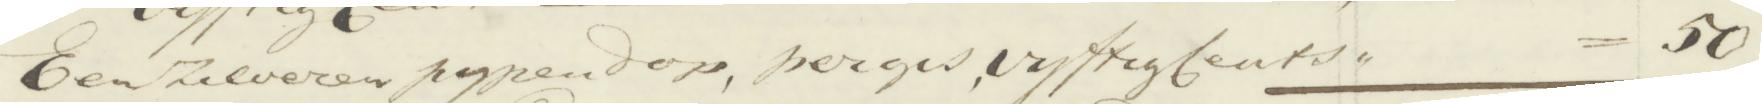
Een zilveren pypendop, per gis, vyftig Cents„ =50
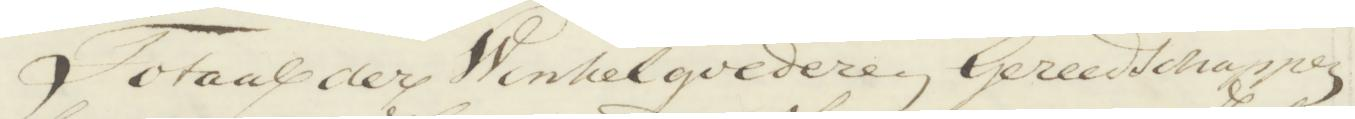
Totaal der Winkelgoederen Gereedschappen
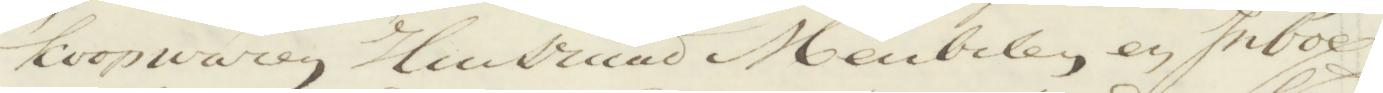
koopwaren Huisraad Meubelen en Jnboe
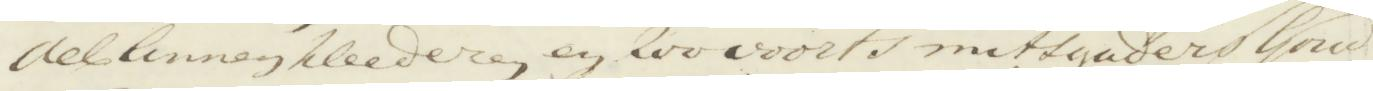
del linnen kleederen en zoo voorts mitsgaders Goud
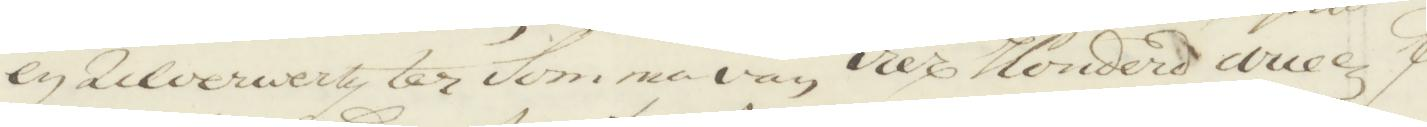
en Zilverwert, ter somma van vier Honderd drie en
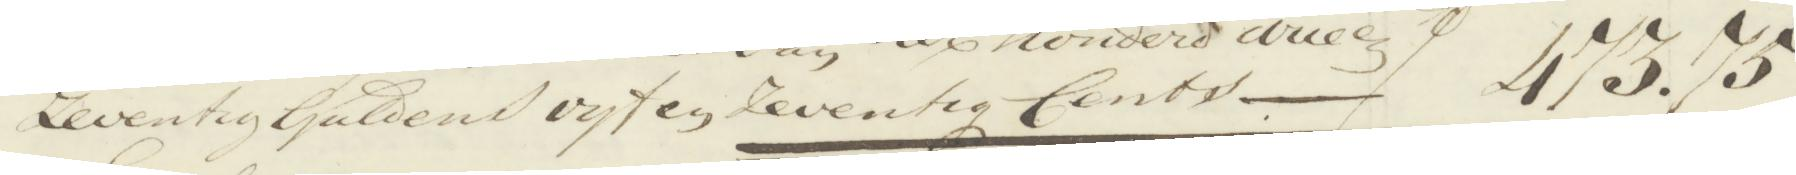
Zeventig Guldens vyf en zeventig Cents — ƒ 473. 75
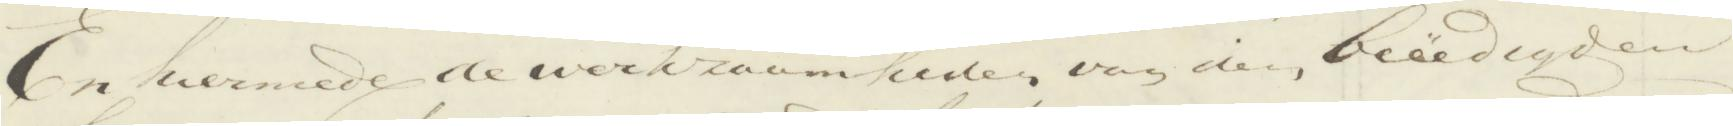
En hiermede de werkzaamheden van den beëdigden
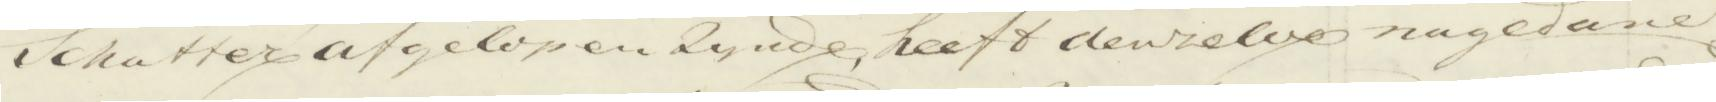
schatter afgelopen zynde, heeft denzelve nagedane
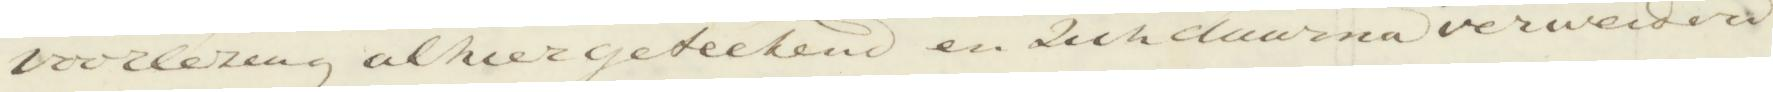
voorlezing alhier geteekend en zich daarna verweiderd
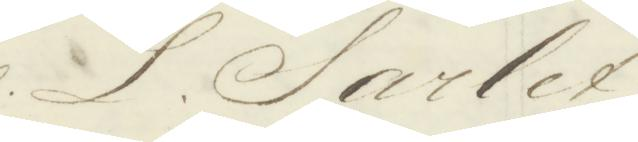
C L. Sarlet
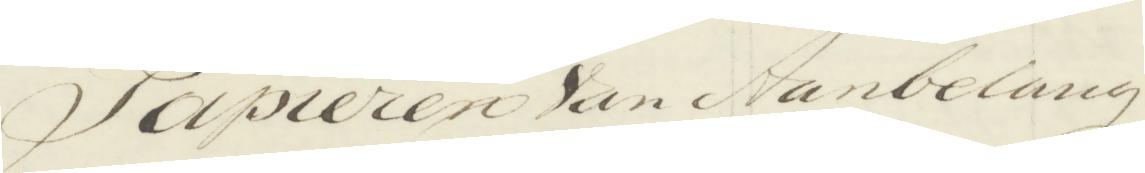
Papieren van Aanbelang
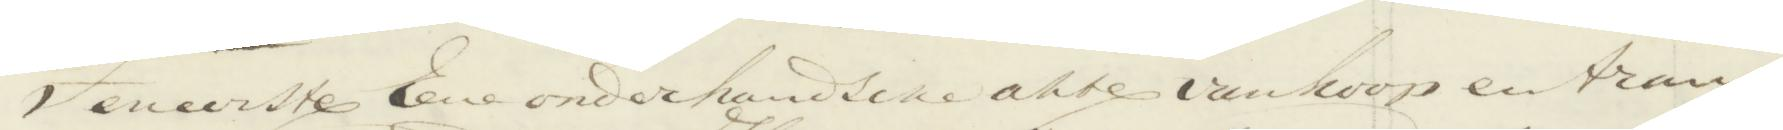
Ten eerste Eene onderhandsche akte van koop en trans
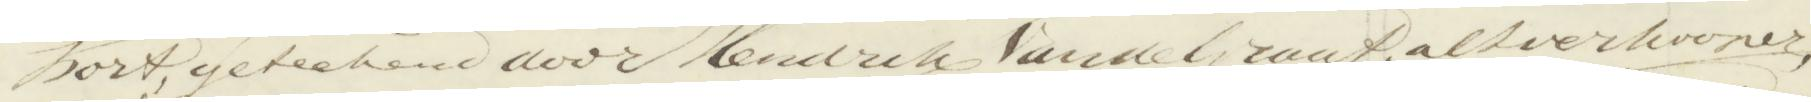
port, geteekend door Hendrik Van de Graaf, als verkooper
